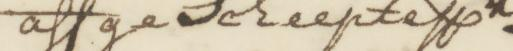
affgescheeptepp-r
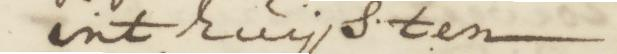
int huijs ten
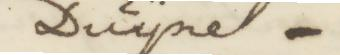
Duijne -
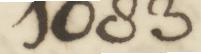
1083
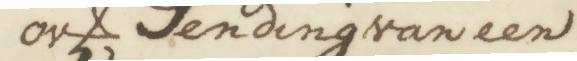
ovver sending van een.
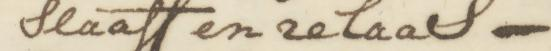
slaaff en relaas -
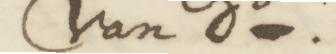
van d-o
